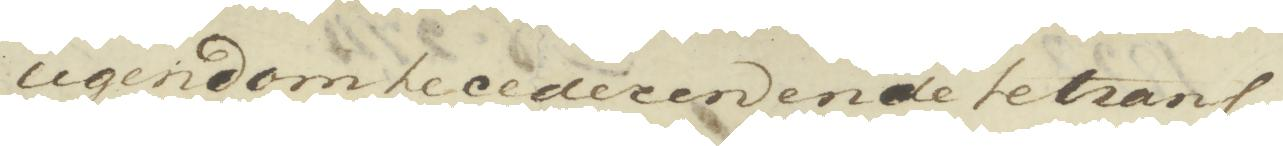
eigendom te cederen ende te trans
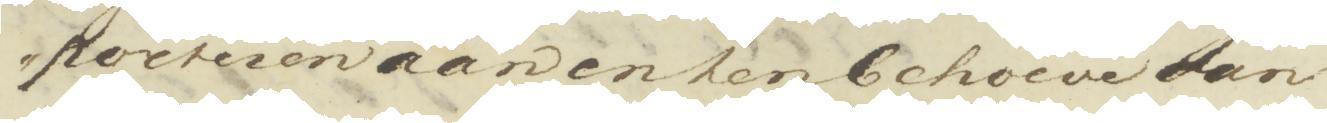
„porteren aan en ten behoeve van
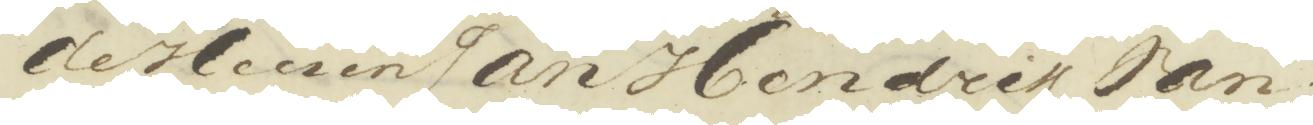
de Heeren Jan Hendrik Van
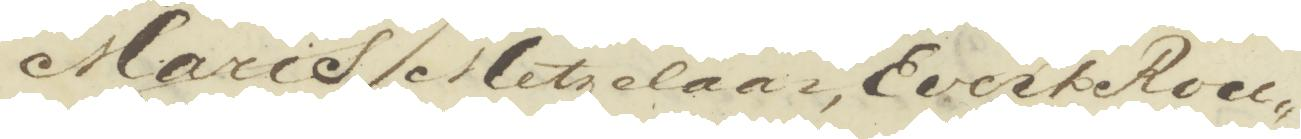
Maris, Metzelaar, Evert Rou„
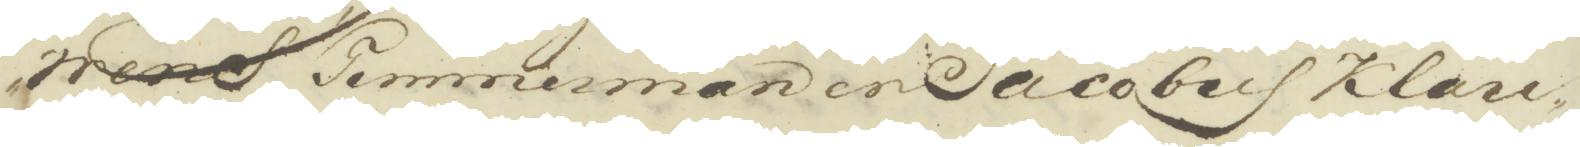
wens, Timmerman en Jacobus Klau„
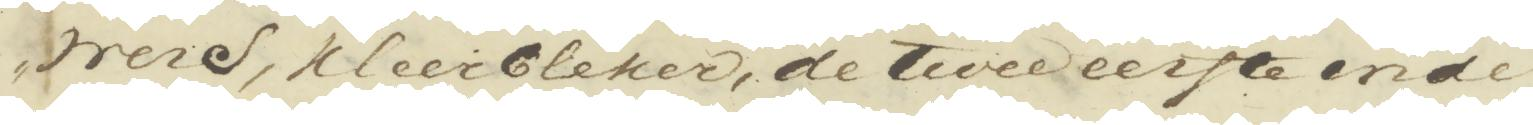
„wers, kleerbleker, de twee eerste in de
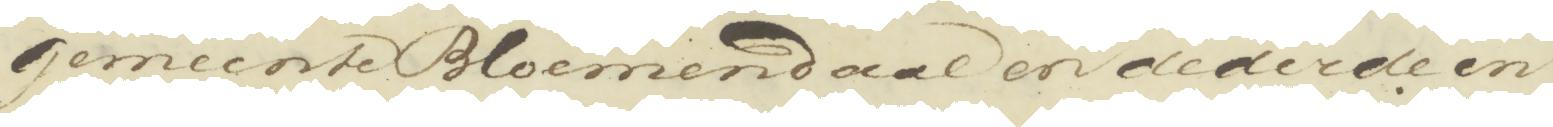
gemeente Bloemendaal en de derde in
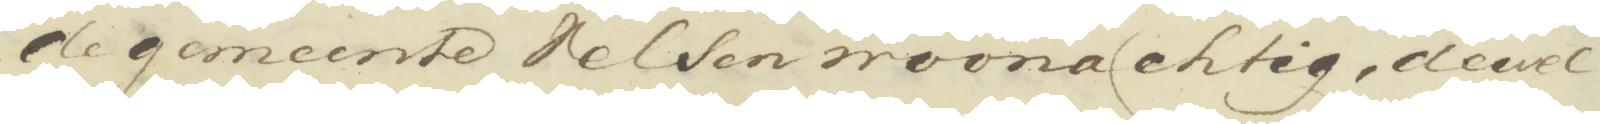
de gemeente Velsen woonachtig, dewel
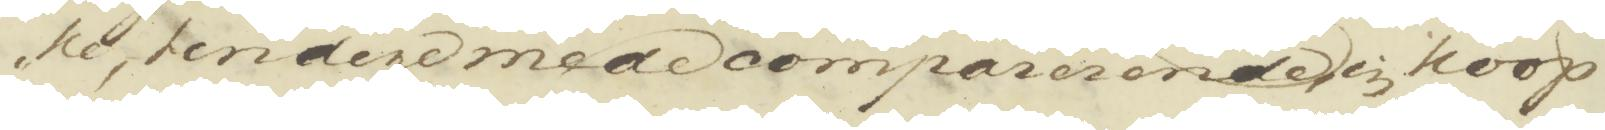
„ke, ten deze mede comparerende, in koop
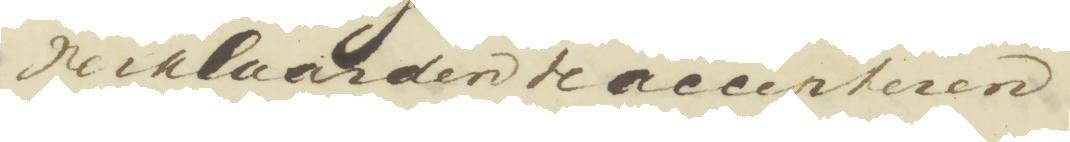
verklaarden te accepteren
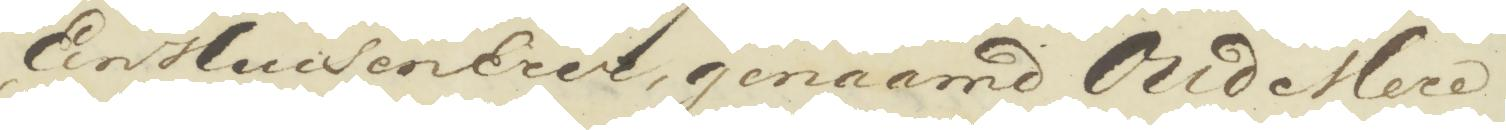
Een Huis en Erve, genaamd Oude Mere
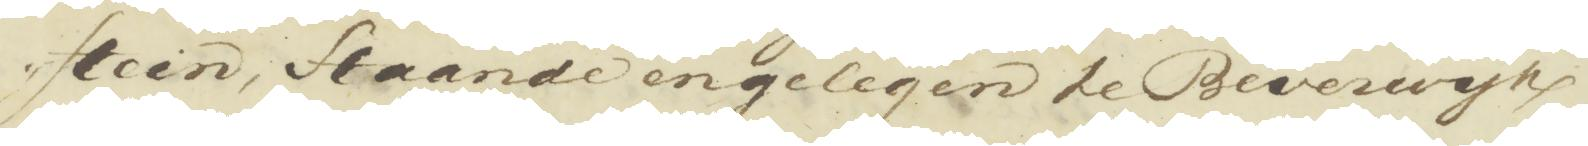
„stein, staande en gelegen te Beverwyk
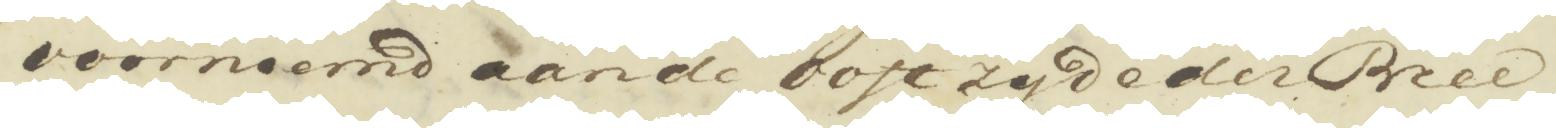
voornoemd aan de oost zyde der Bree
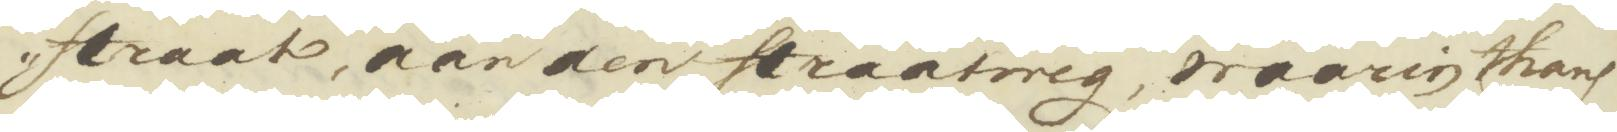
straat, aan den straatweg, waarin thans
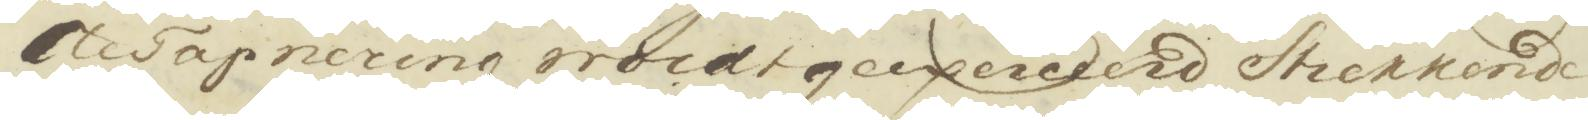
de Tapnering wordt geexerceerd strekkende
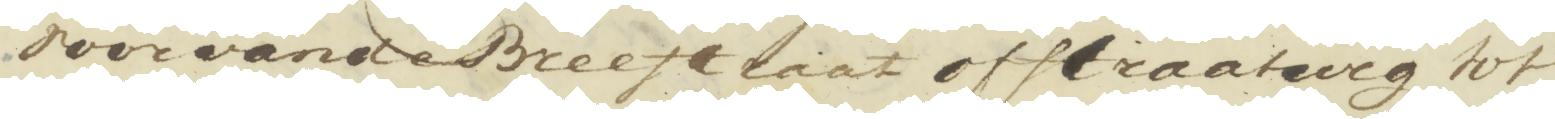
voor van de Breestraat of straatweg tot
